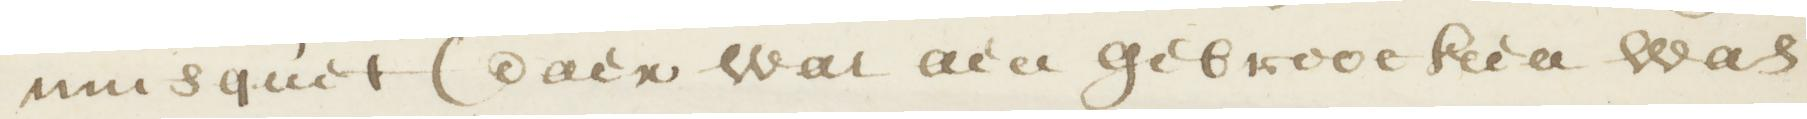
musquet (daer wat aen gebroocken was
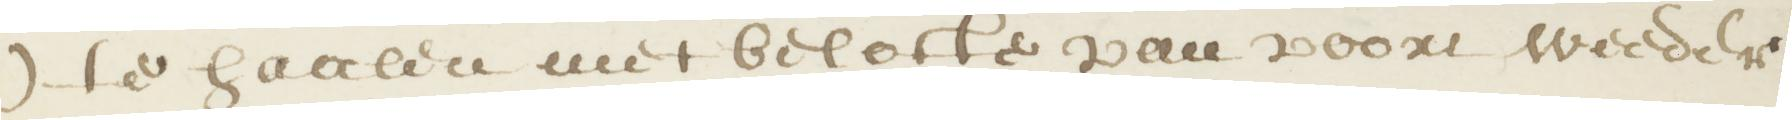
) te haalen met belofte van voort weeder
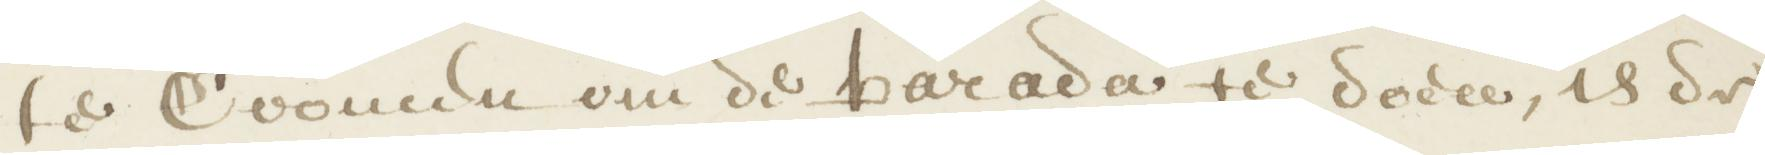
te Coomen om de parada te doel, is de
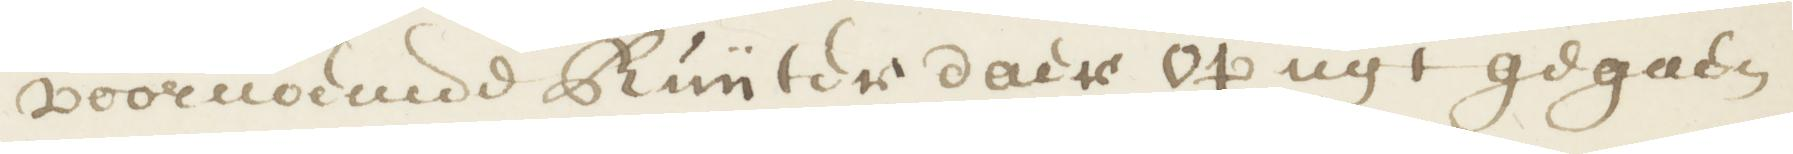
voornoemde Ruijter daer op uijt gegaen
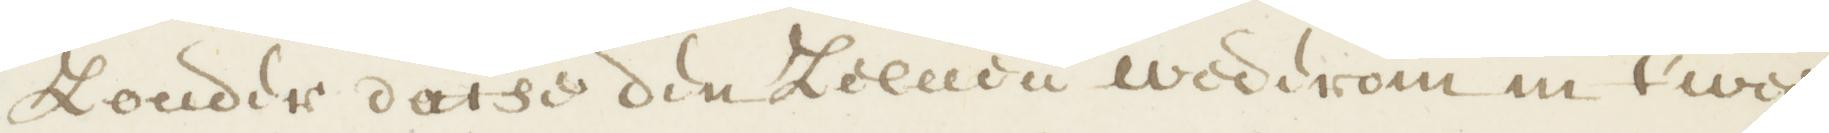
zonder datse der zeluen wederom in twee
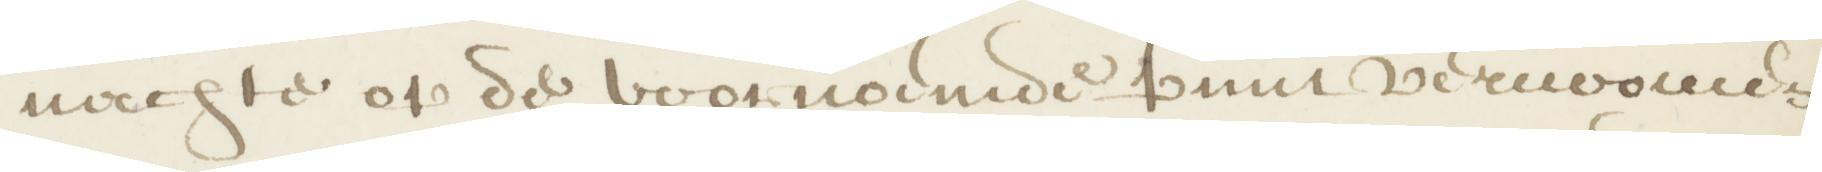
nachte op de voornoemde punt vernomen
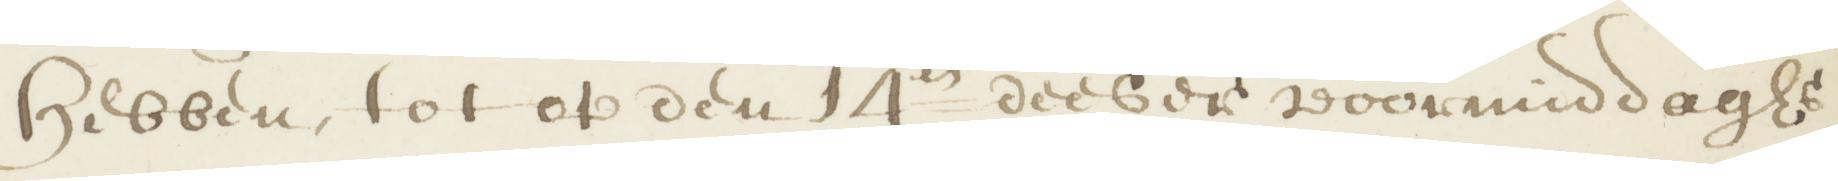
hebben, tot op den 14=en deeser voormiddaghs
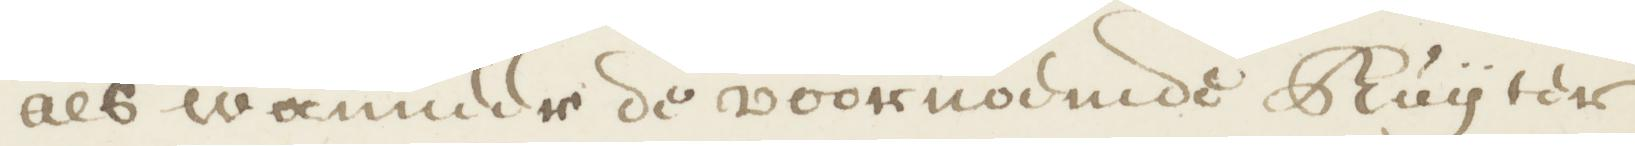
als wanneer de voornoemde Rhuijter
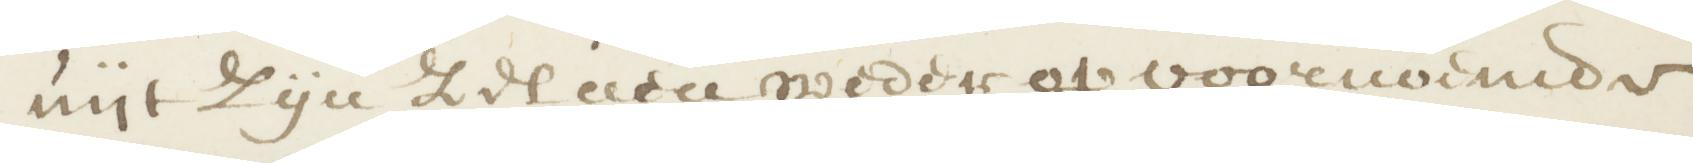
uijt zijn zeluen weder op voornoemde
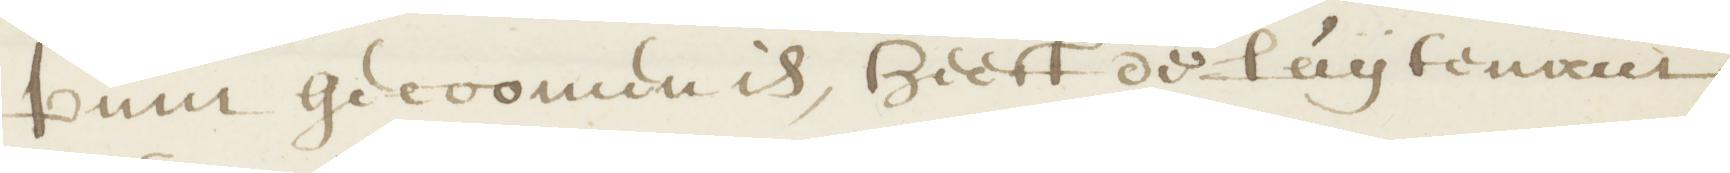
punt gecoomen is, heeft de luijtenant
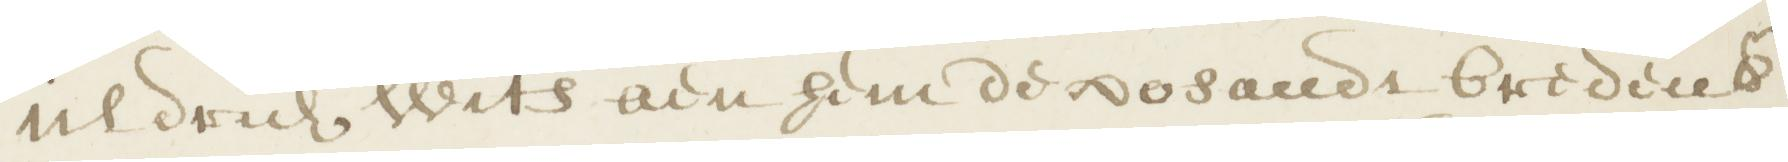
uldrich wits aen hem deposandt bredenb
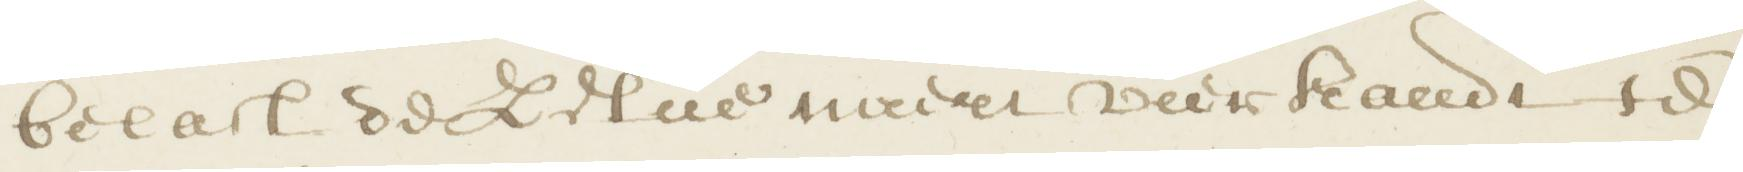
belast dezelue naert vierkandt te
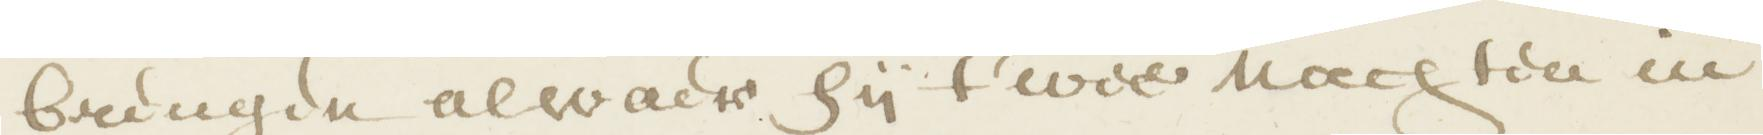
brengen alwaer hij twee nachten en
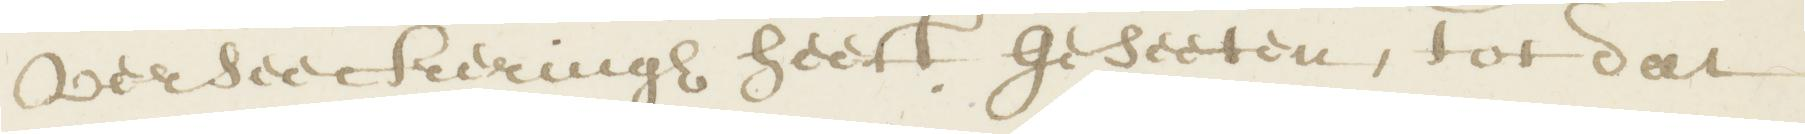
verseeckeringh heeft geseeten, tot dat
